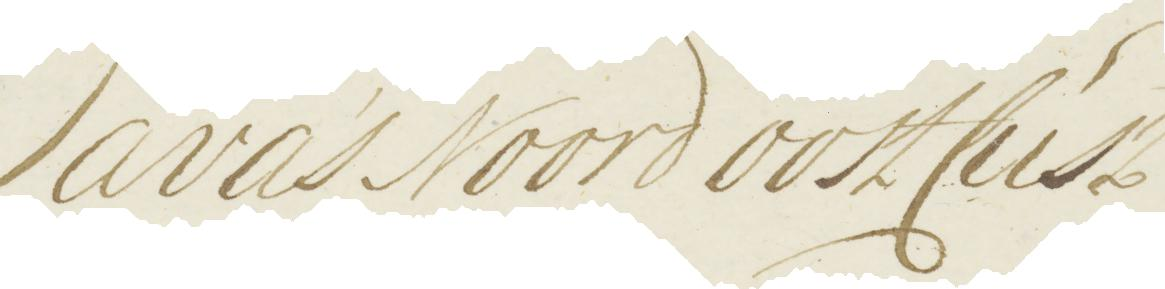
Iava's Noord oost Cust
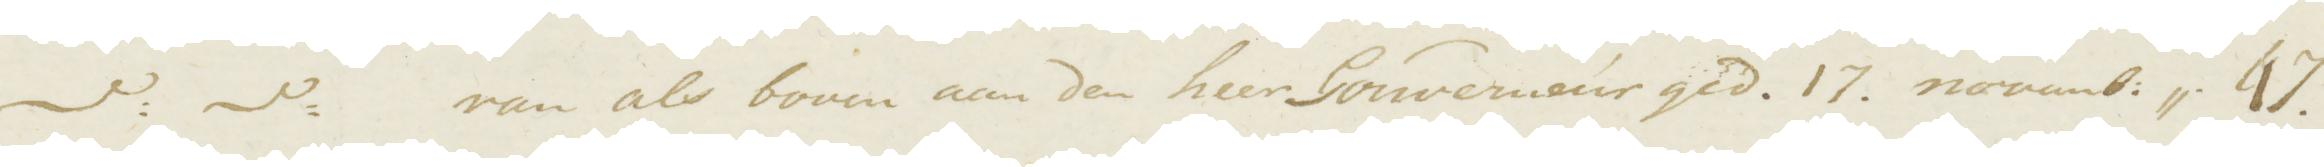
D=o D=o van als boven aan den heer Gouverneur ged. 17. novemb: „. 47.
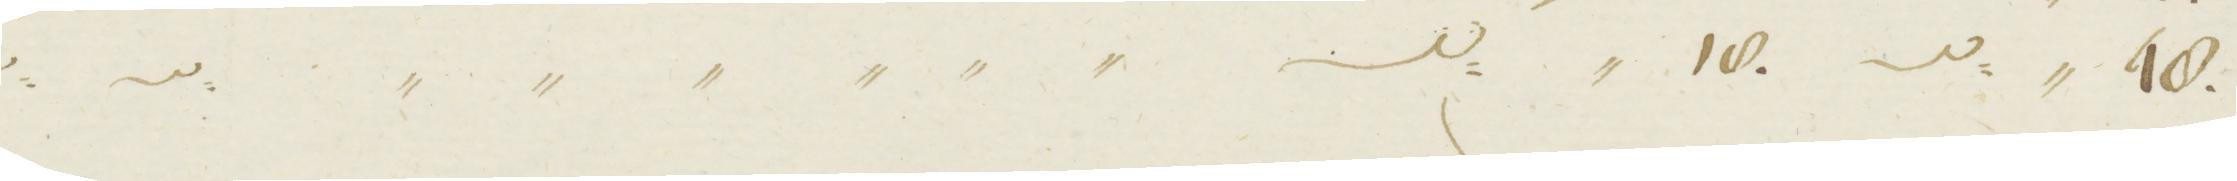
D=o „ „ „ D=o „ 18. D=o „ 48.
